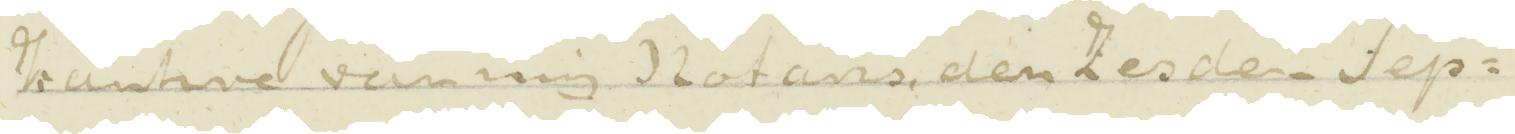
kantore van mij Notaris, den zesden Sep=
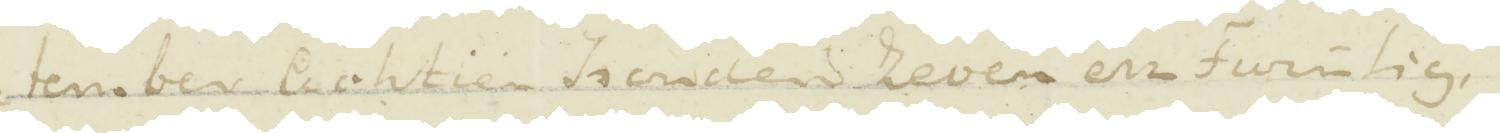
„tember Achtien honderd zeven en Twintig.
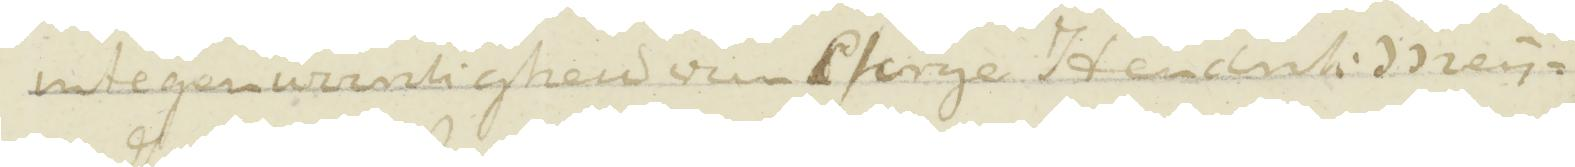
integenwoordigheid van Gorge Hendrik Meij=
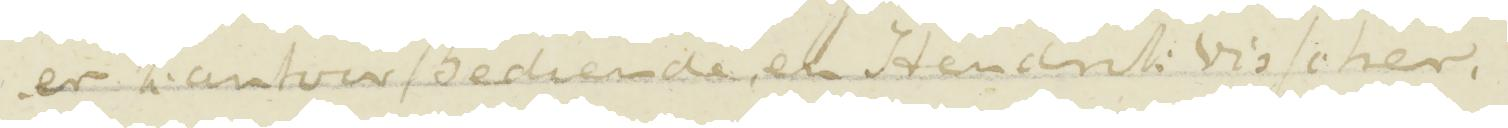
er kantoor Bediende, en Hendrik visscher,
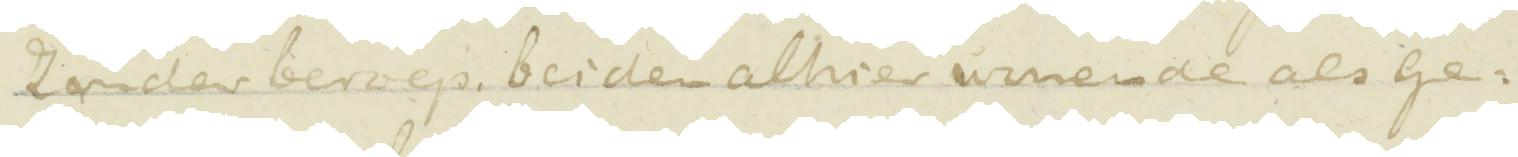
zonder beroep. Beiden alhier wonende als ge=
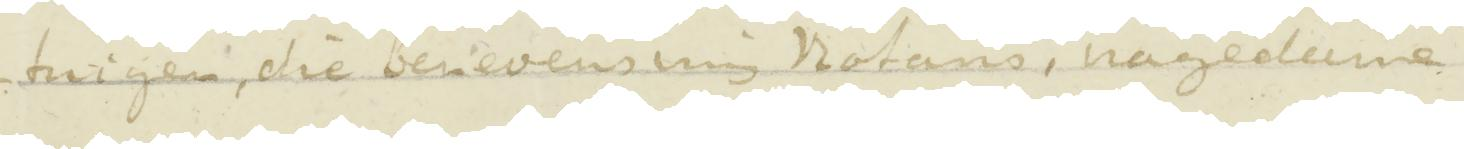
tuigen, die benevens mij Notaris, na gedane
